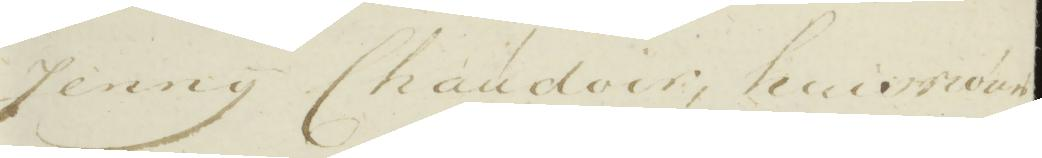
Jennij Chaudoir, huisvrouw
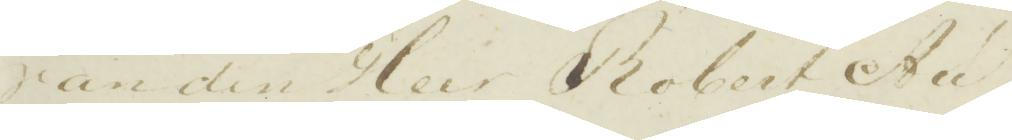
van den Heer Robert Au
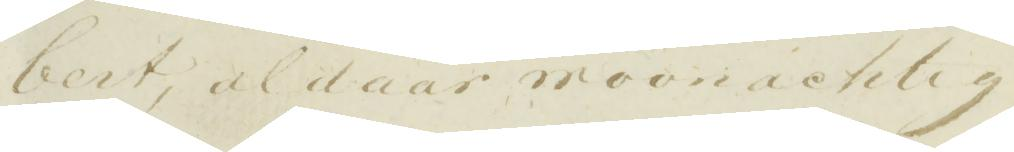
bert, aldaar woonachtig
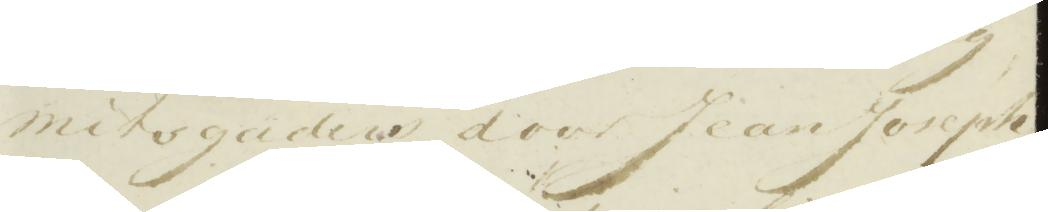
mitsgaders door Jean Joseph
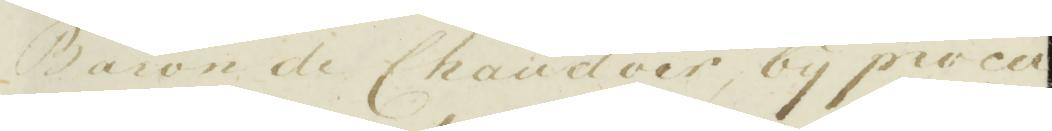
Baron de Chaudoir, bij procu
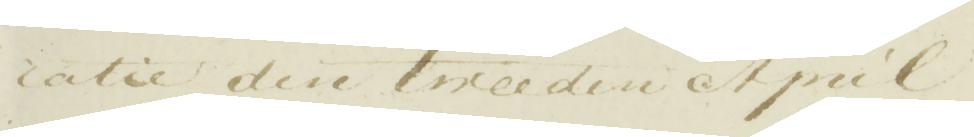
ratie den tweeden April
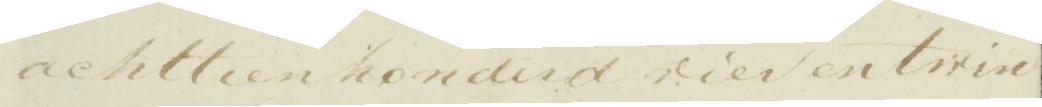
achttien honderd vier en twin
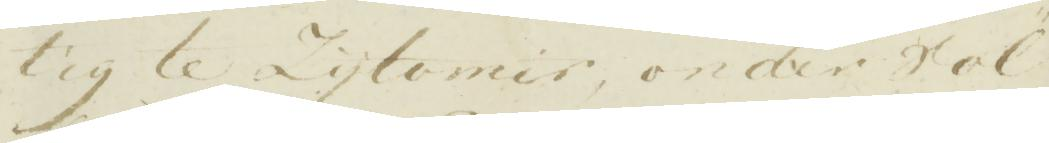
„tig te Zijtomir, onder vol
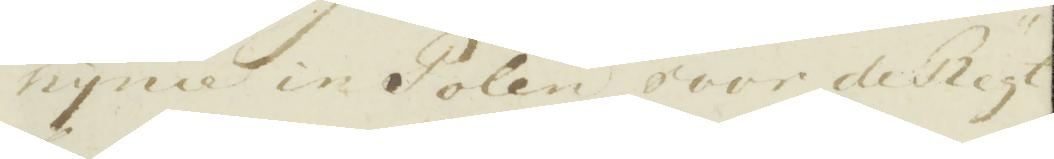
hijnie in Polen voor de Regt
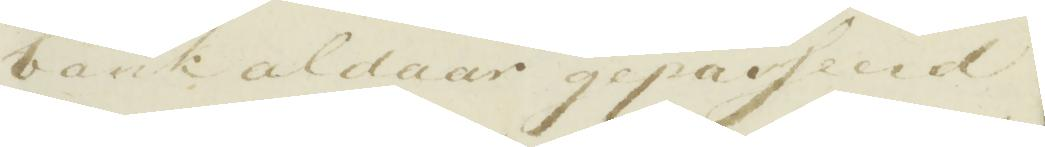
bank aldaar gepasseerd
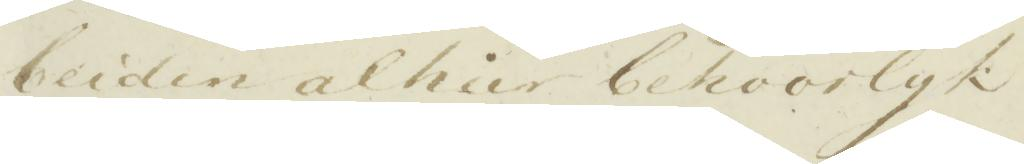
beiden alhier behoorlyk
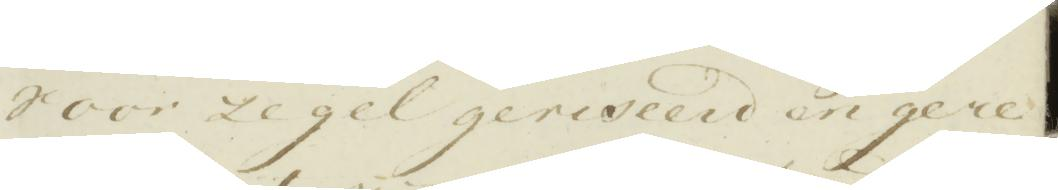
voor zegel geviseerd en gere
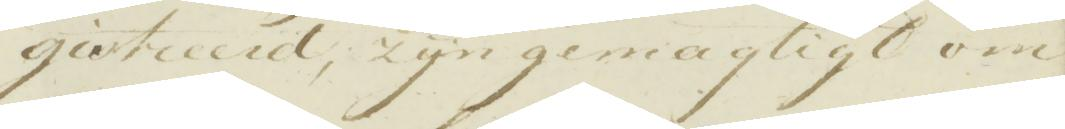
gistreerd, zijn gemagtigt om
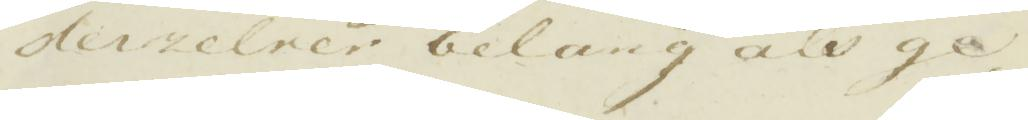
derzelver belang als ge„
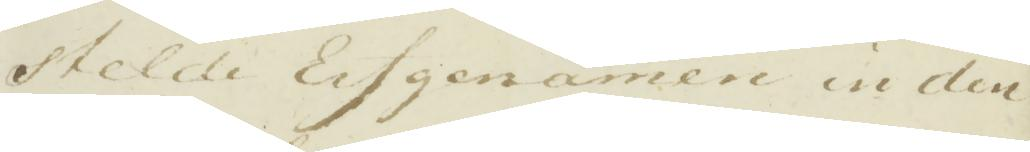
stelde Erfgenamen in den
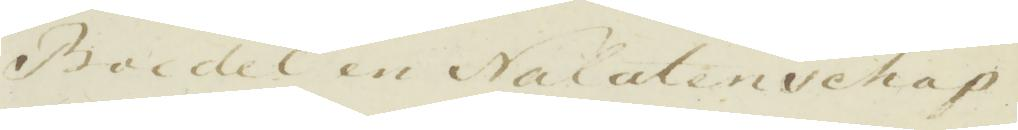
Boedel en Nalatenschap
